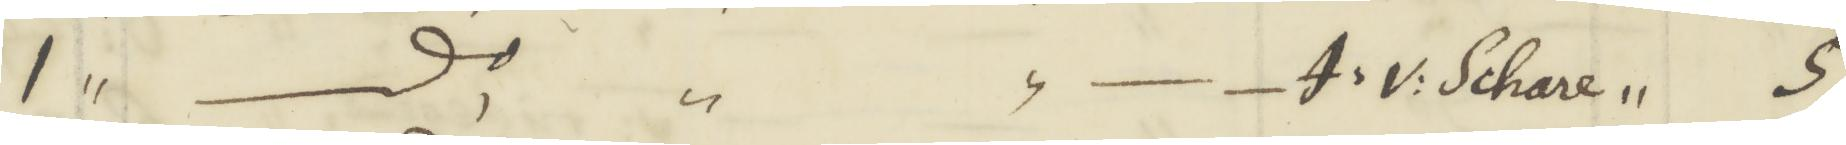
1 „ _,o „ „ — — f: v: Schare „ 5
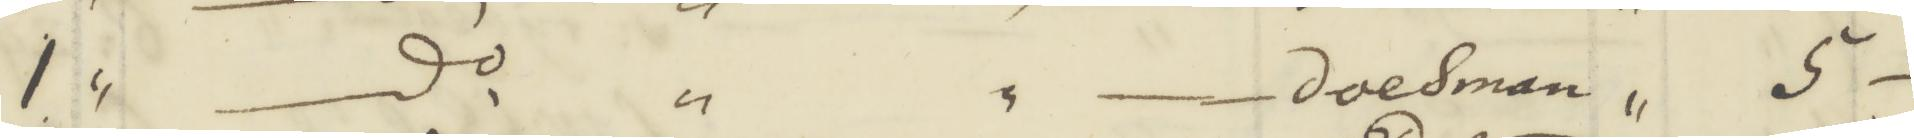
1. „ _,o „ „—— doesman „ 5-
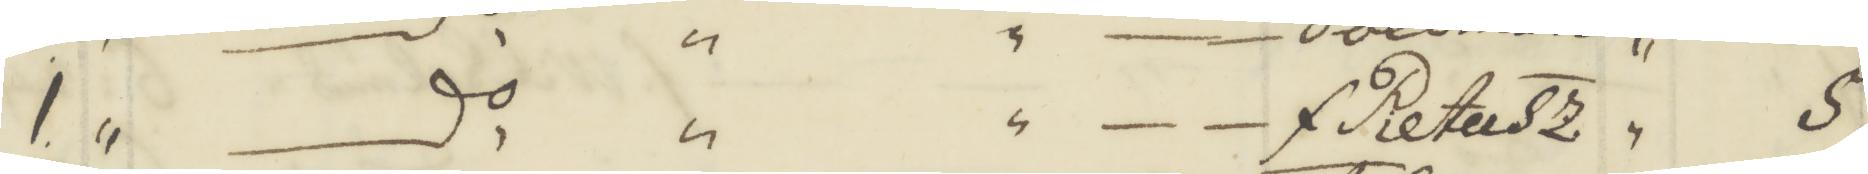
1. „ _,o „ „ — — f Pieters: „ 5
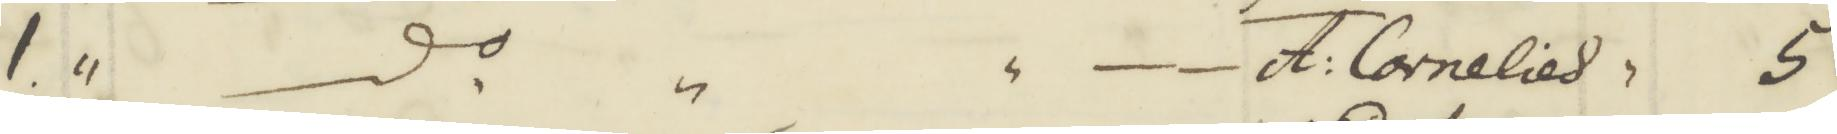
1. „ _,o „ „ — — A: Cornelies „ 5
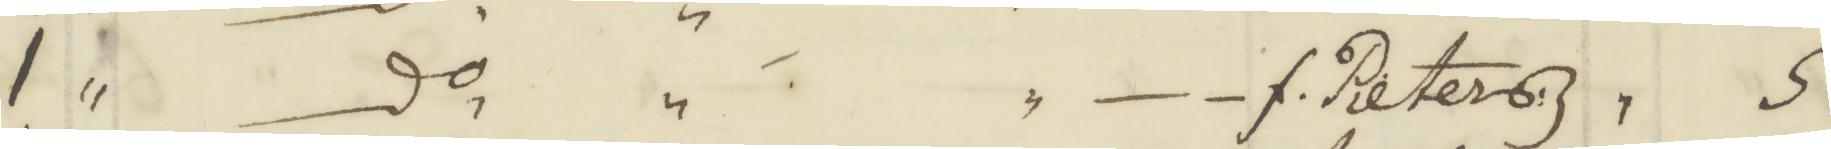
1. „ _,o „ „ — — ƒ. Pieters: „ 5
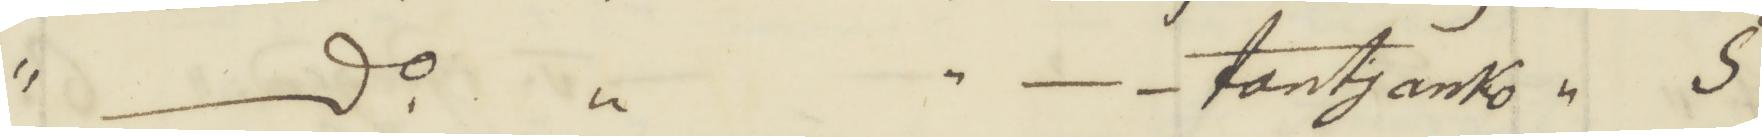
„ _:o „ „ — — tantjank „ 5
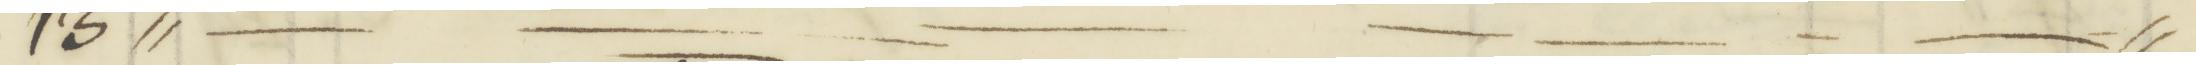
13 „ — — — — — - — „-
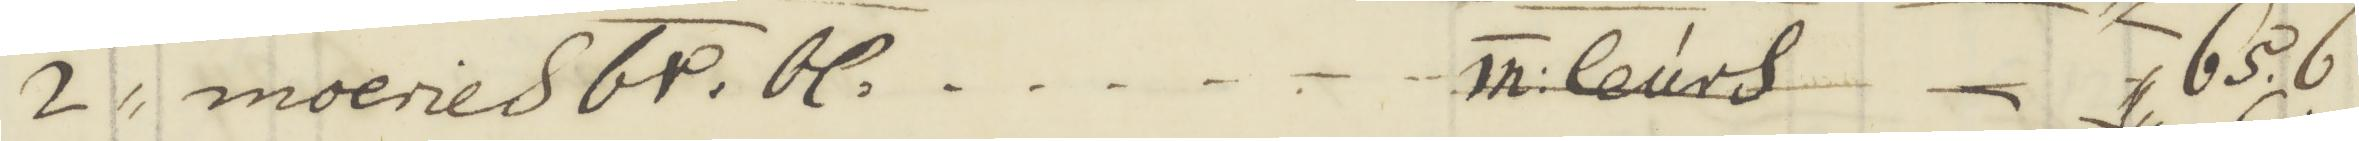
2„ moeries br: bl: . . . - - m:leurs „ 65:6
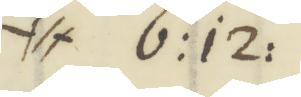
„ 6:12:
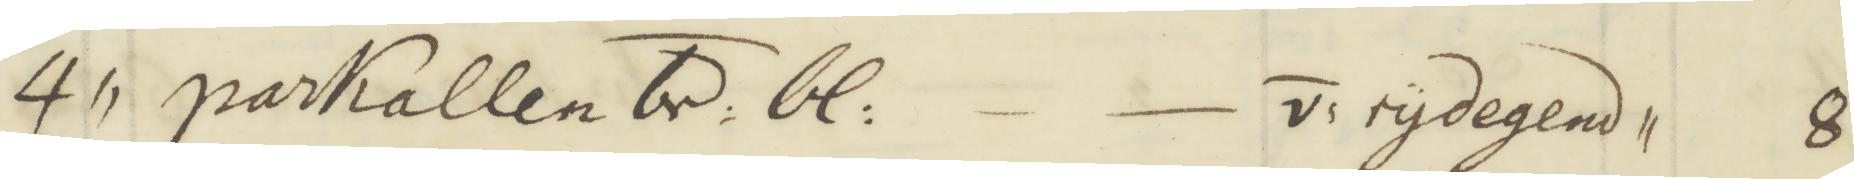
4„ parkallen br: bl: — — v: rijdegend„ 8
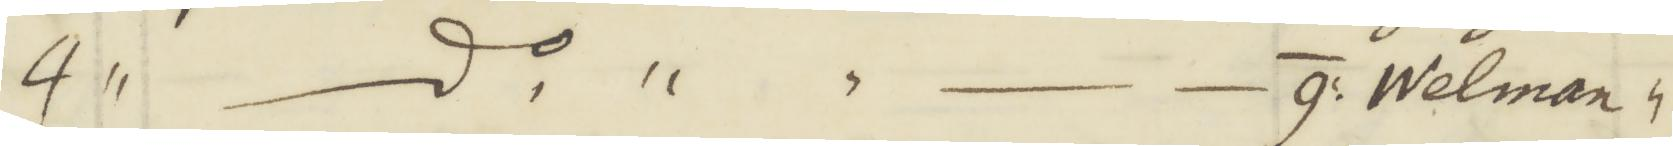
4„ _:o „ „ g: Welman „
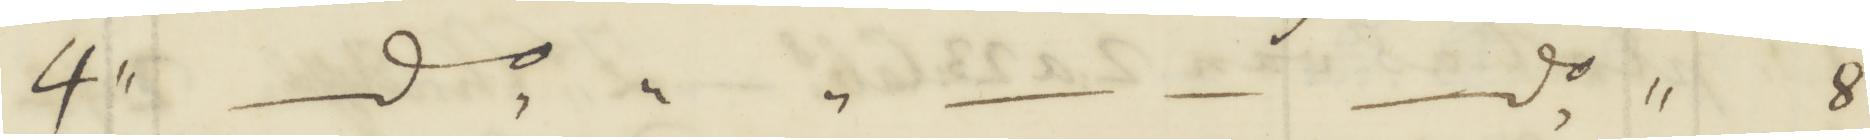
4„ _,o „ „ — — d,o „ 8
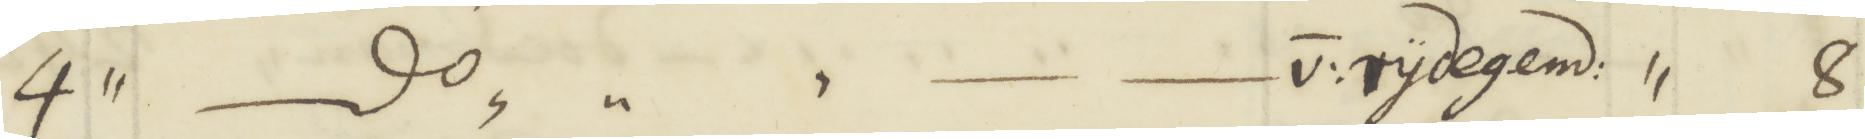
4„ _„o „ „ — — v: rijdegem: „ 8
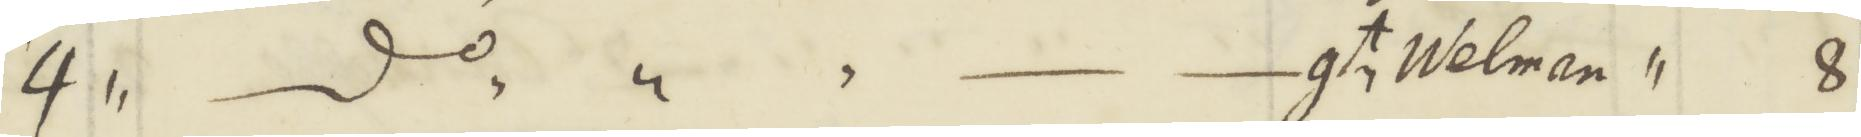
4„ _„o „ „ — — g,t Welman 8
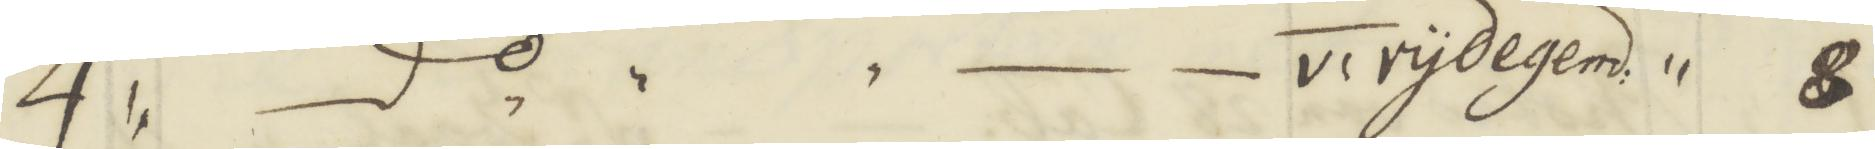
4„ _„o „ „ „ v: rijdegend:„ 8
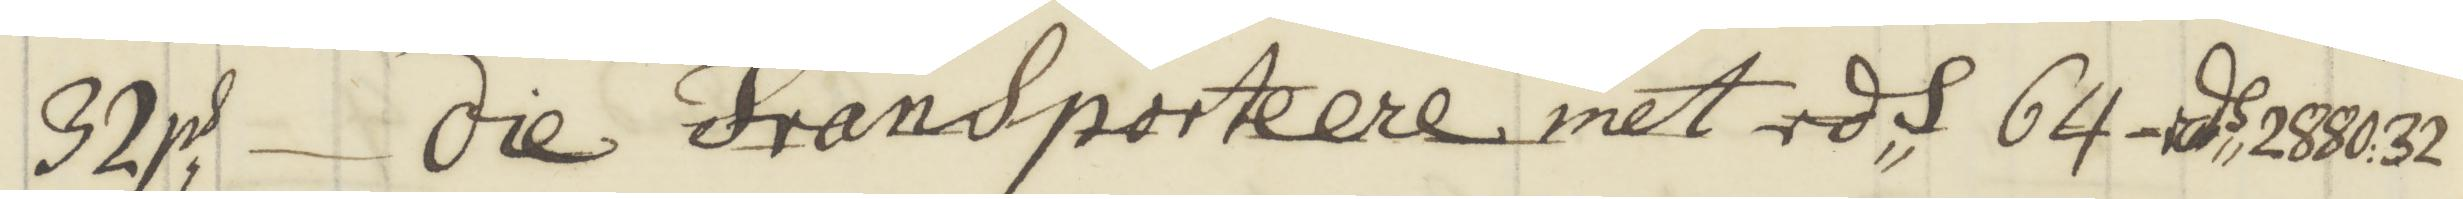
32p„s — die Transporteere met rd„ s 64-rd„s 2880:32
